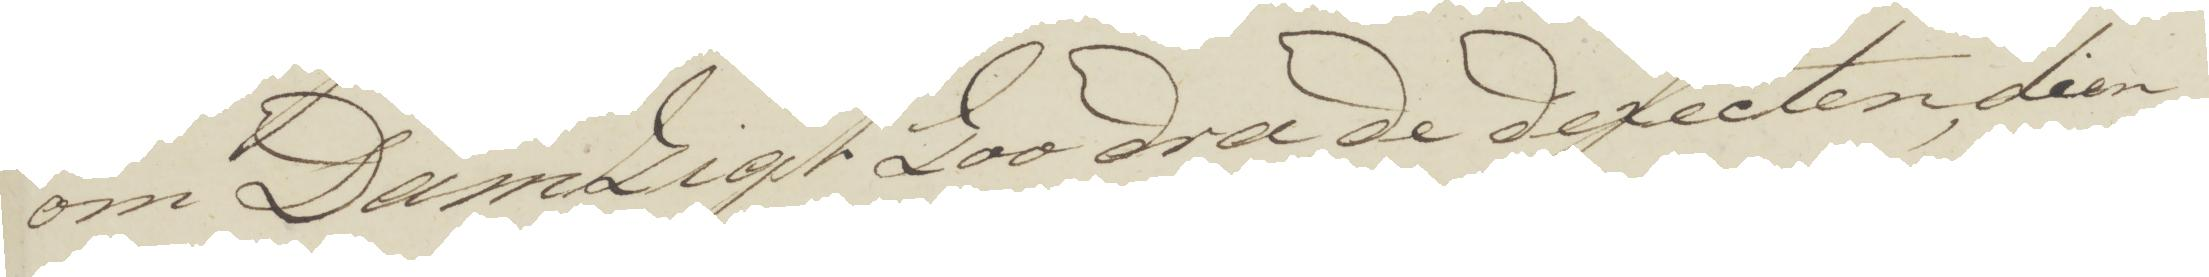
om Damzigt zoo dra de defecten, dien
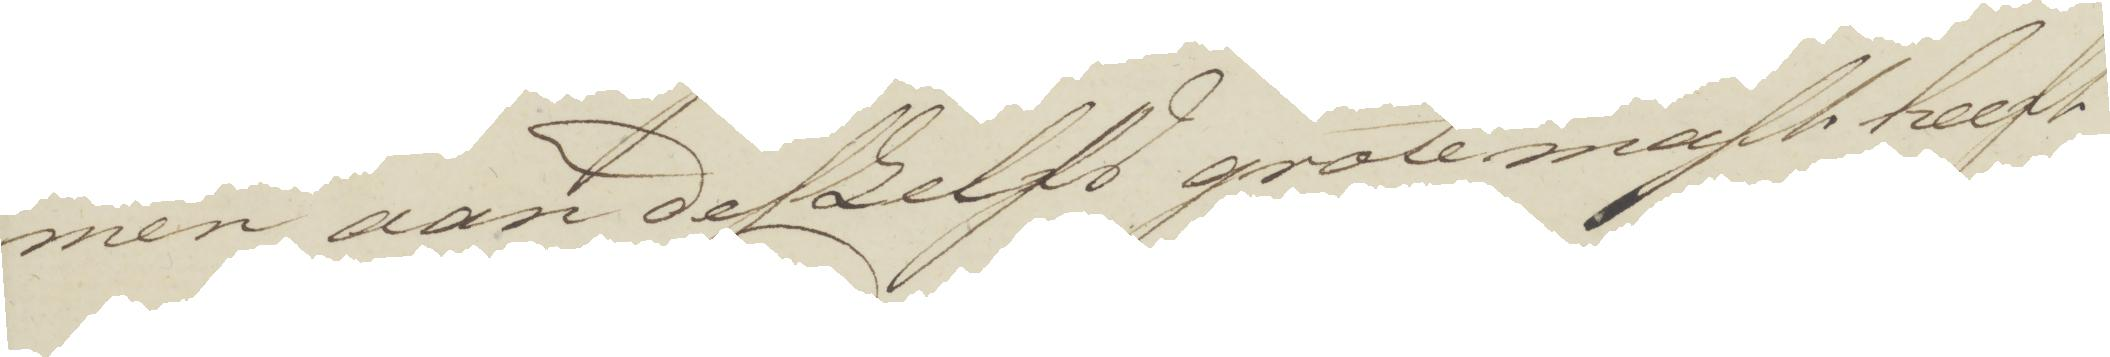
men aan deszelfs grotemast heeft
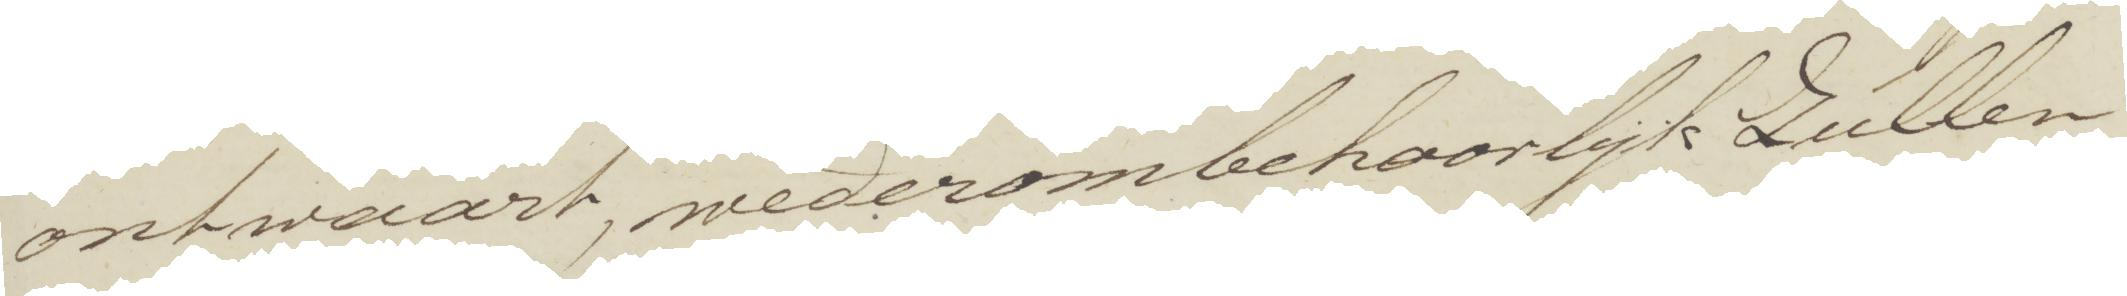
ontwaart, wederom behoorlijk zullen
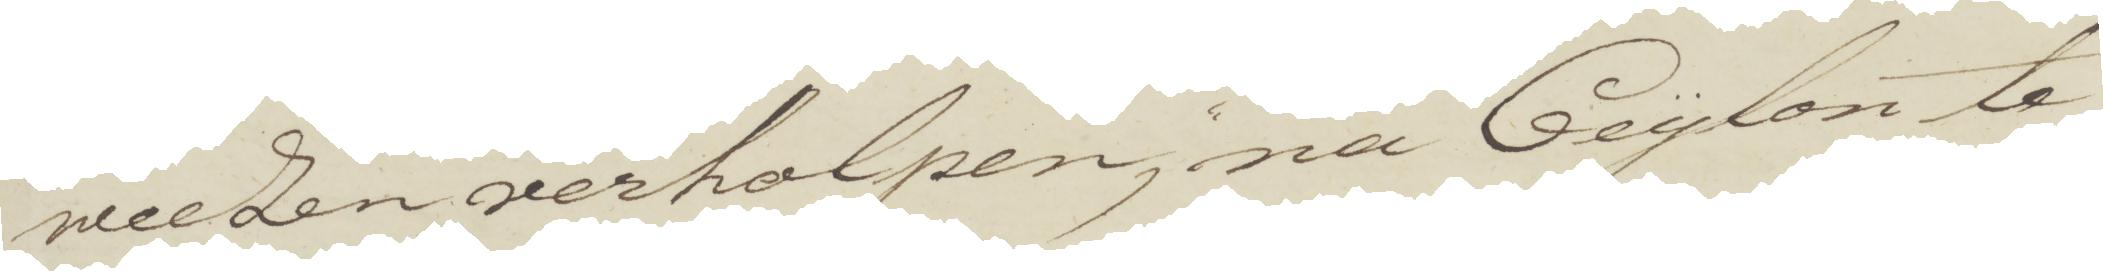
weezen verholpen; na Ceijlon te
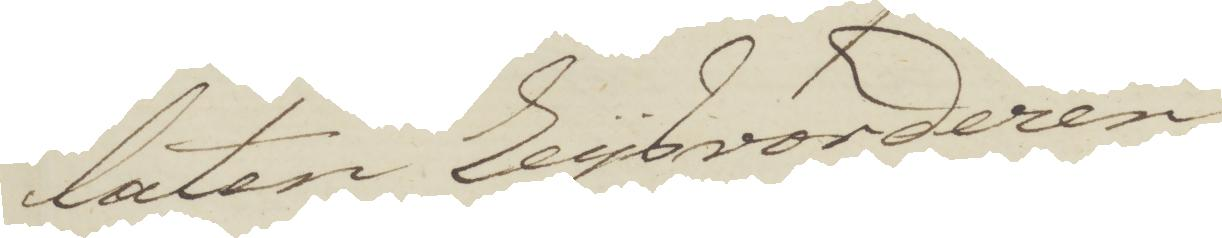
laten reijsvorderen,
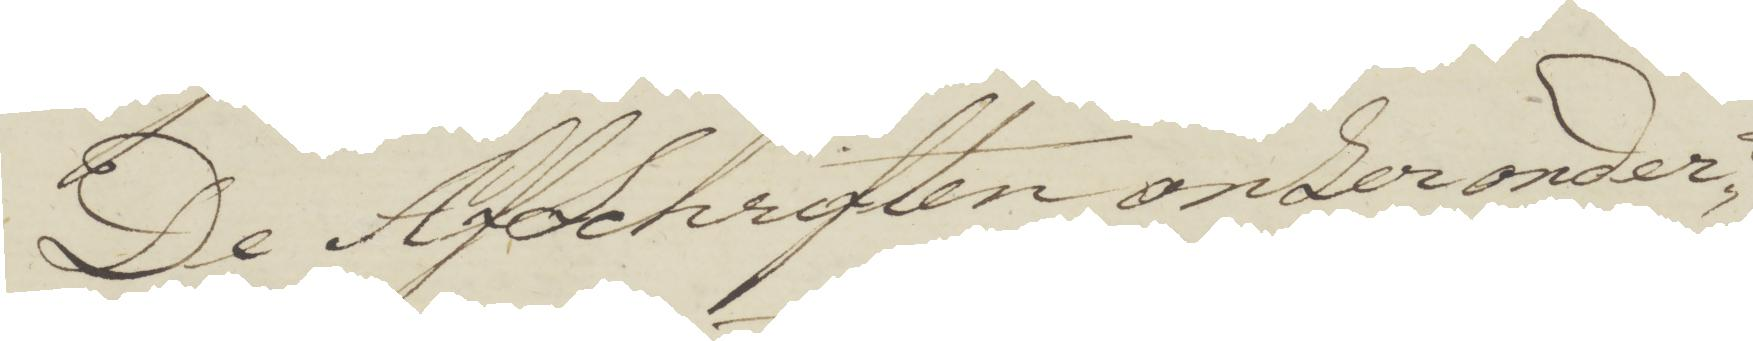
De Afschriften onzer onder„
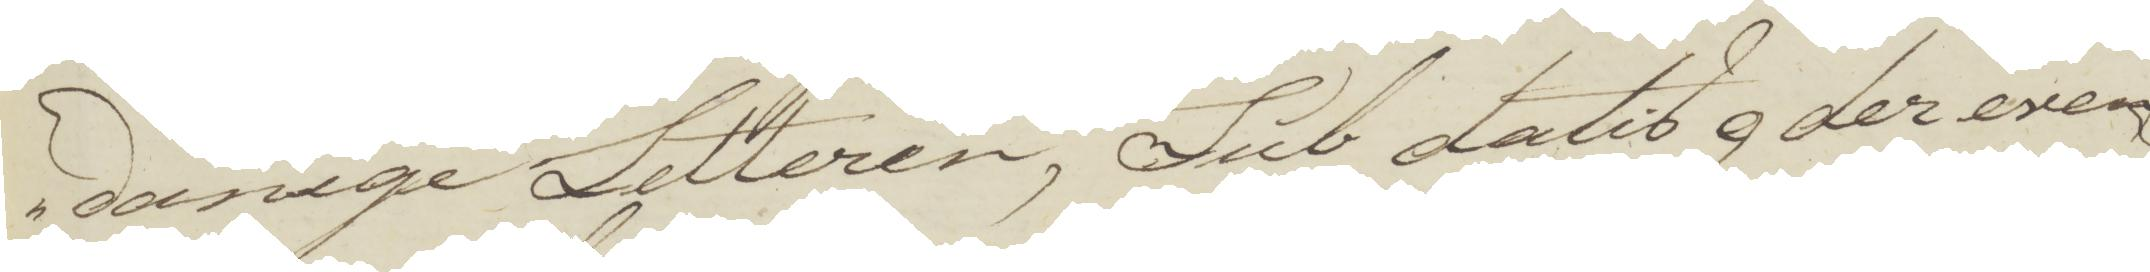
„danige Letteren, sub datis 9 der even
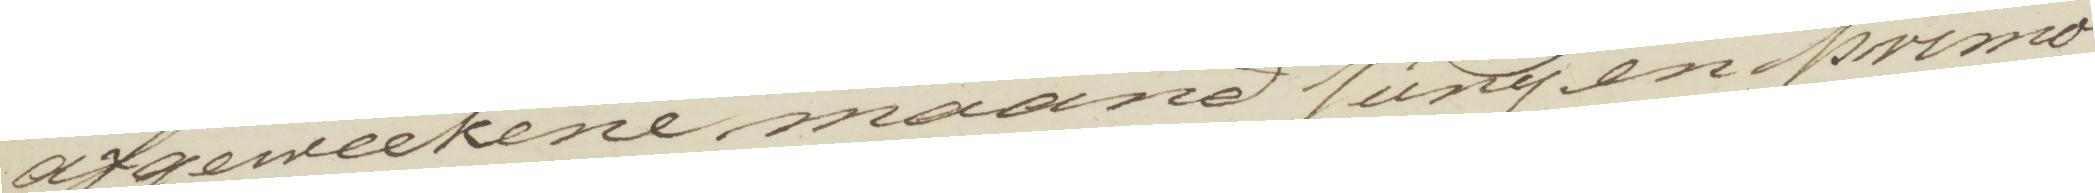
afgeweekene maand Junij en primo
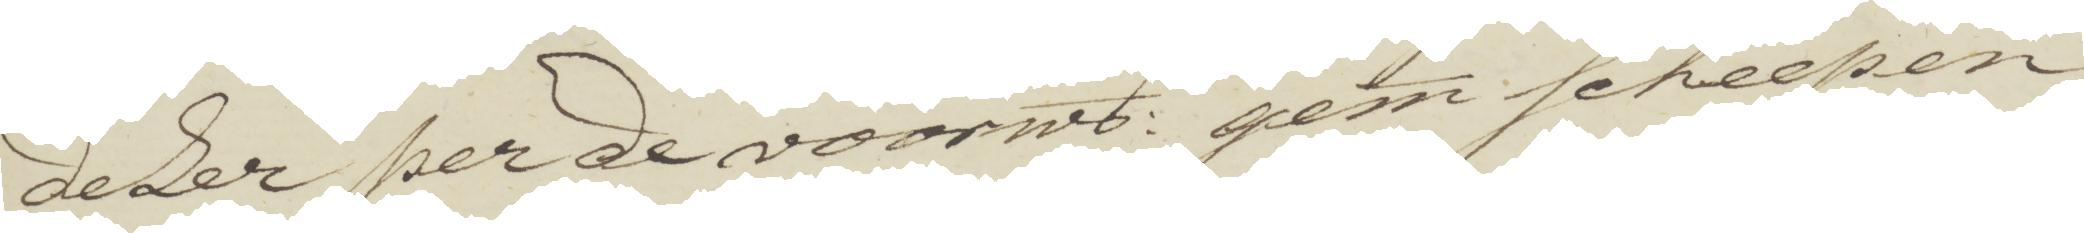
dezer per de voorws: gem scheepen
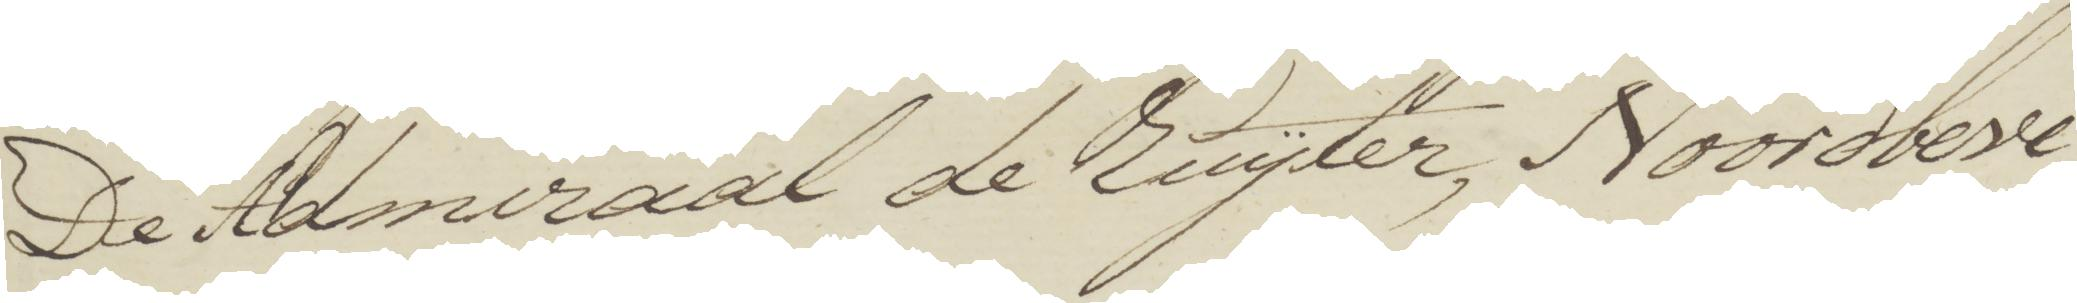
De Admiraal de ruijter, Noordbeve
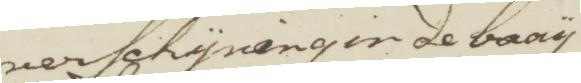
verschijning in de baaij
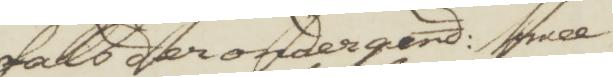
fals der onder gend: twee
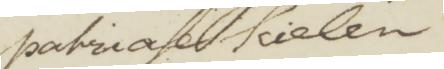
patriase kielen
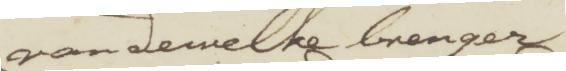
van dewelke brenger
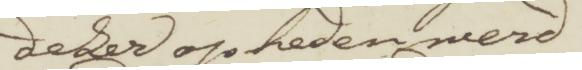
dezer opheden werd
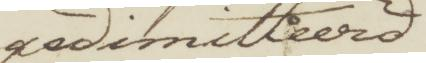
gedimitteerd
